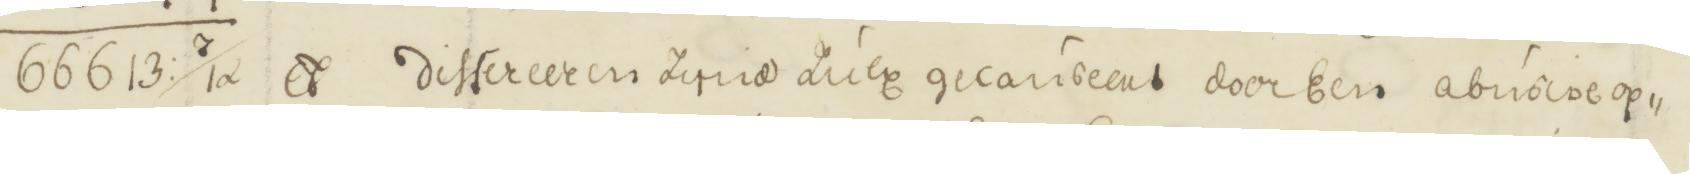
66613: 7/12 lb differeeren zynde Zulx gecauseert door Een abusive op„
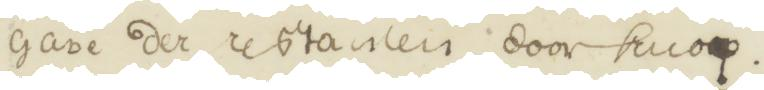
gave der restanten door knop.
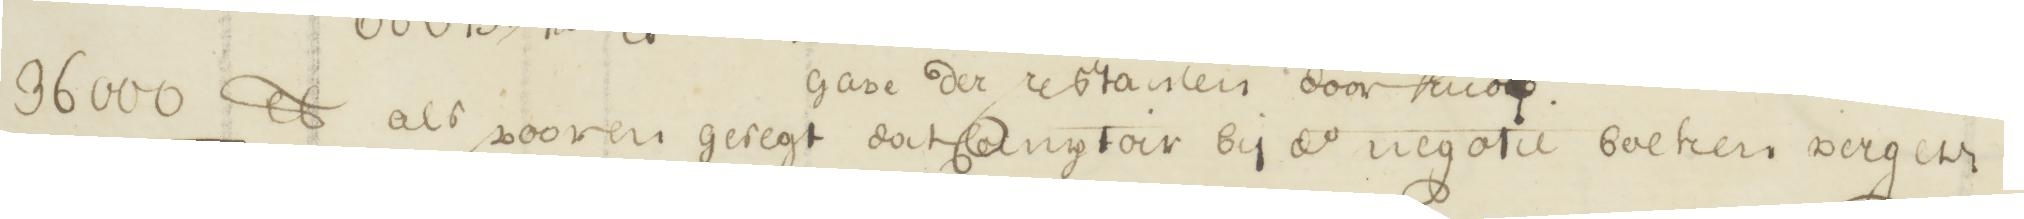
36000 lb als vooren gesegt dat Comptoir bij de negotie boeken vergeten
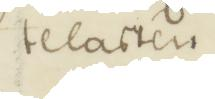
te lasten
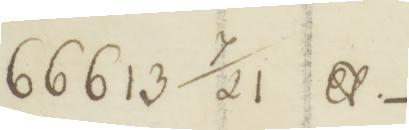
66613 7/21 lb. —
